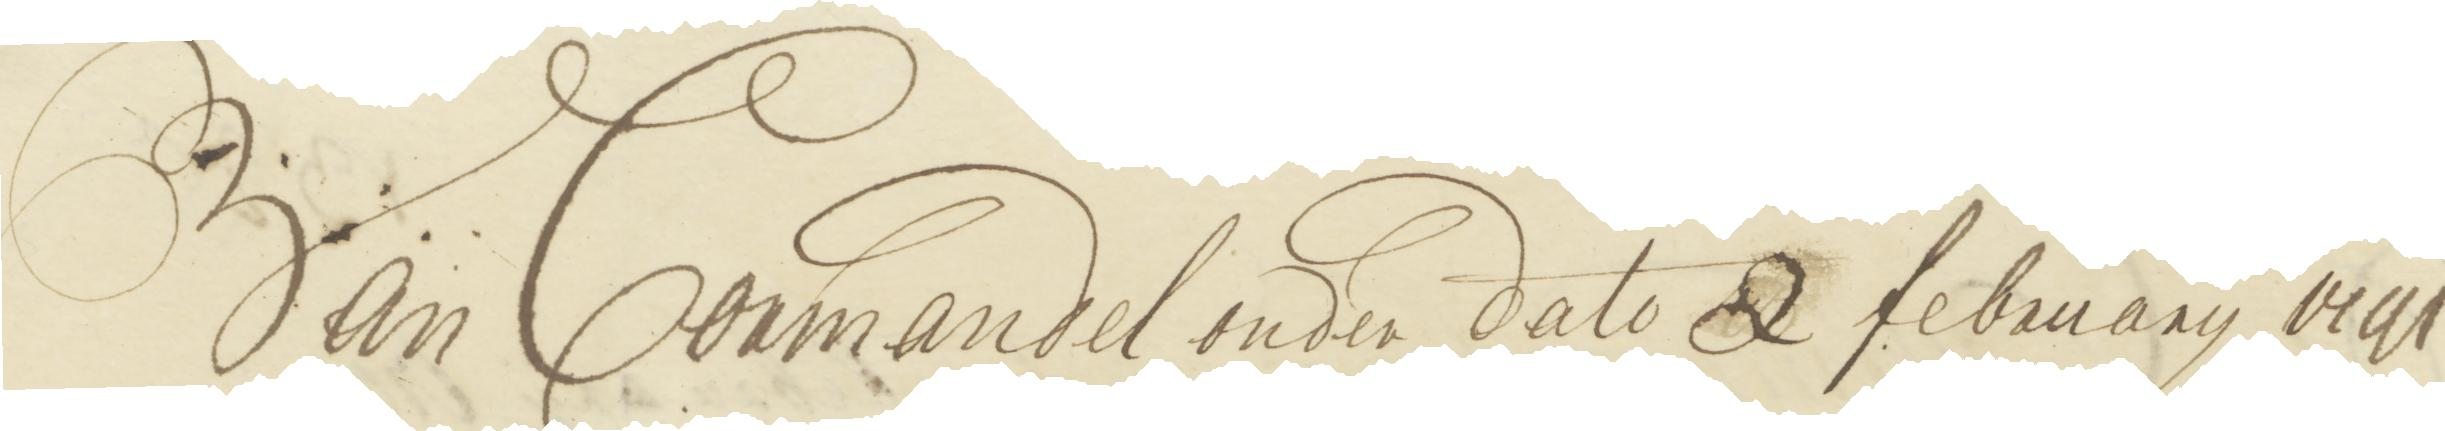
Van Cormandel onder dato 2: febuarij 1741
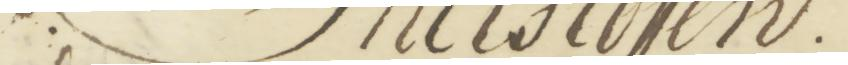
Snitstoffen.
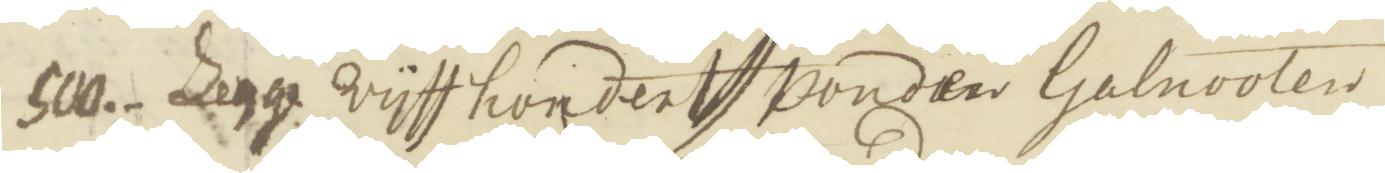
500. — Zegge vijff hondert ponden Galnooten
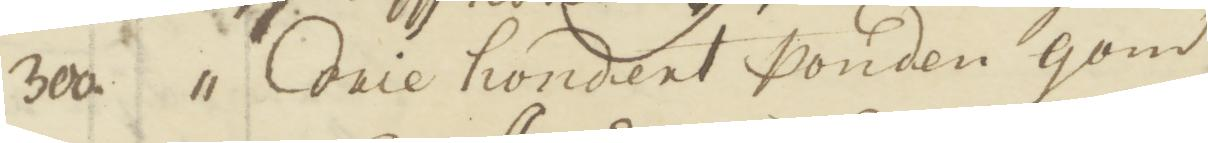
300. „ drie hondert ponden gom
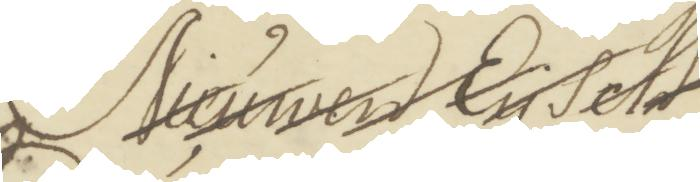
Nieuwen Eijsels
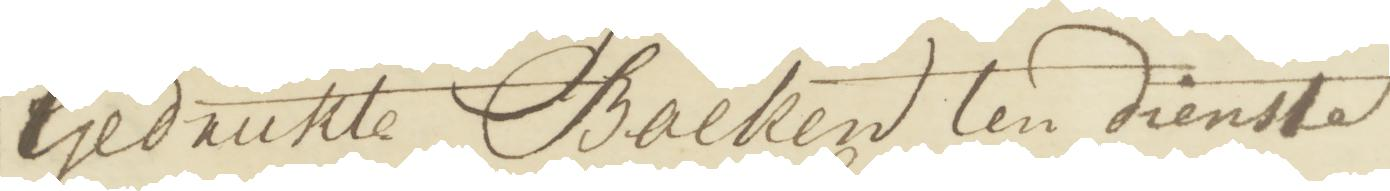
Gedrukte Boeken ten dienste
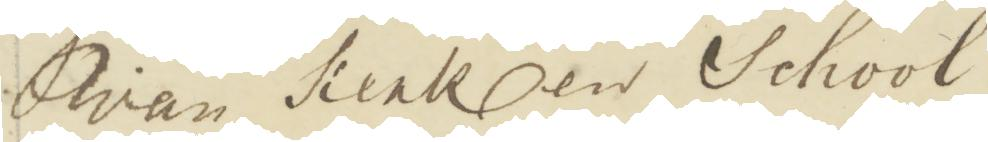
van kerk en school
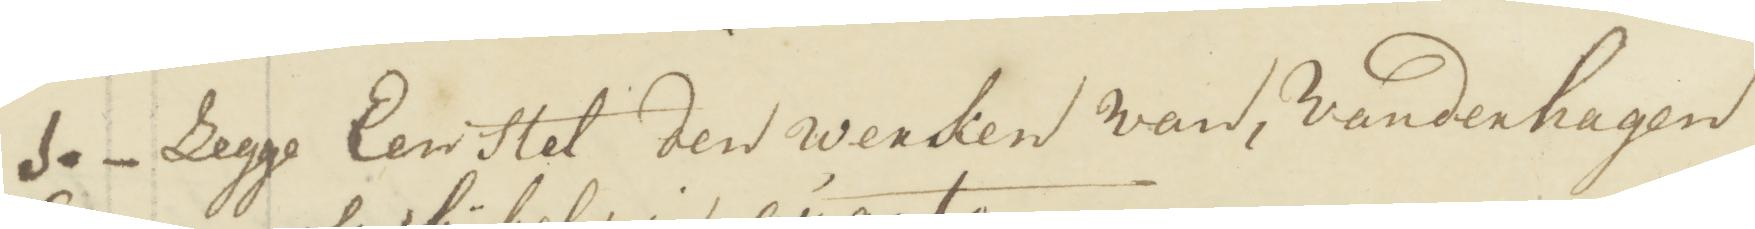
1. — ~Zegge Een stel den werken van, Vanderhagen
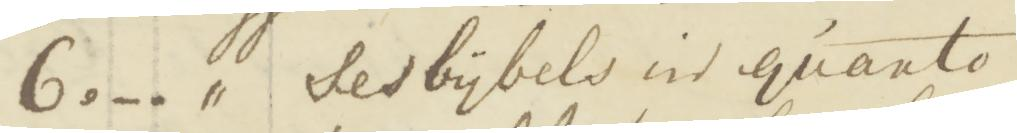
6. —. „ ses bijbels in quarto
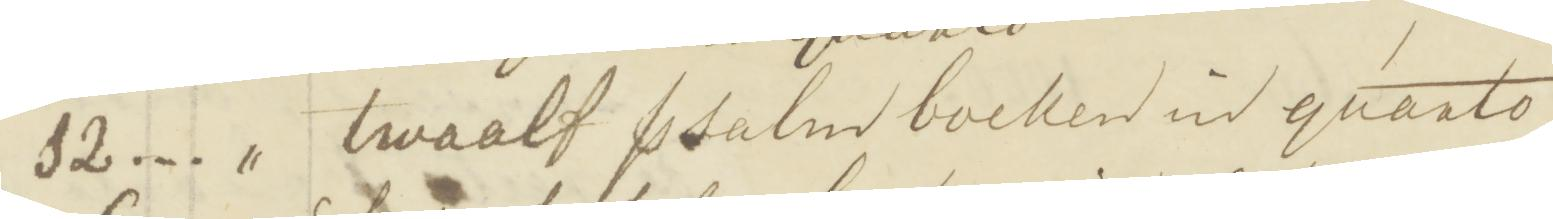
12. —. „ twaalf Psalm boeken in quarto
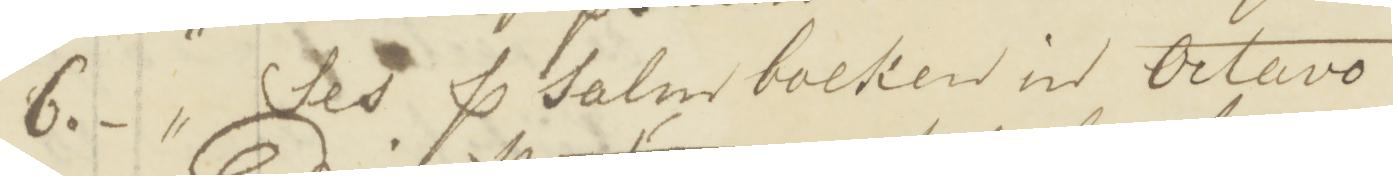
6. — „ ses Psalm boeken in Octavo
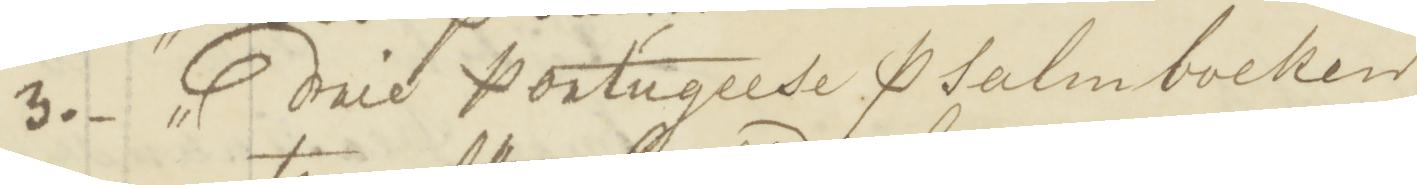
3. — „ drie Portugeese psalm boeken
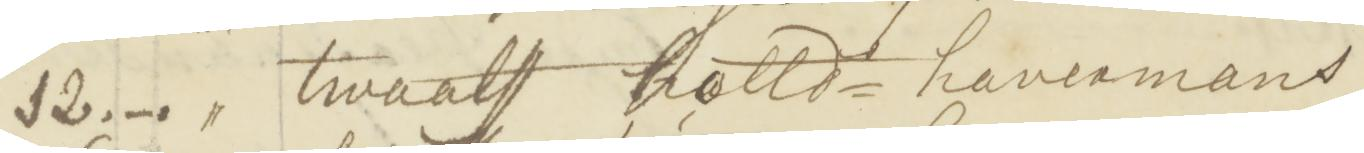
12. — „ twaalf holld=' havermans
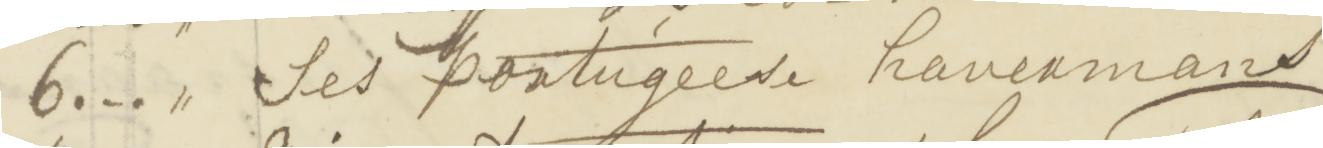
6. —. „ ses Portugeese havermans
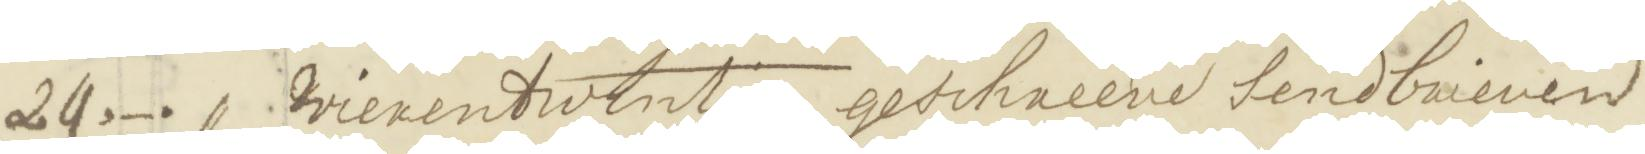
24. —. „ vierentwintig geschreeve sendbrieven
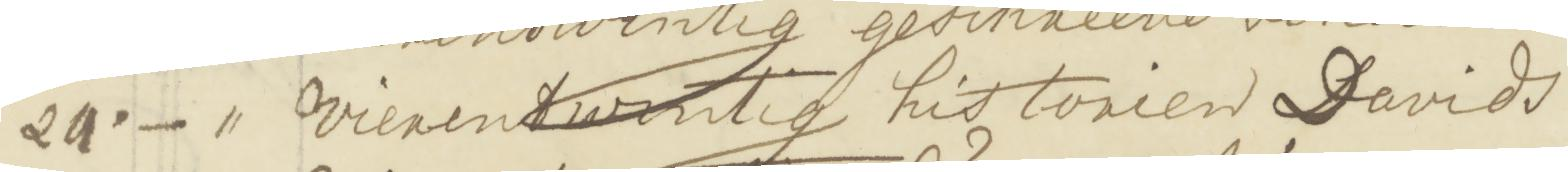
24. — „ vierentwintig historien Davids
